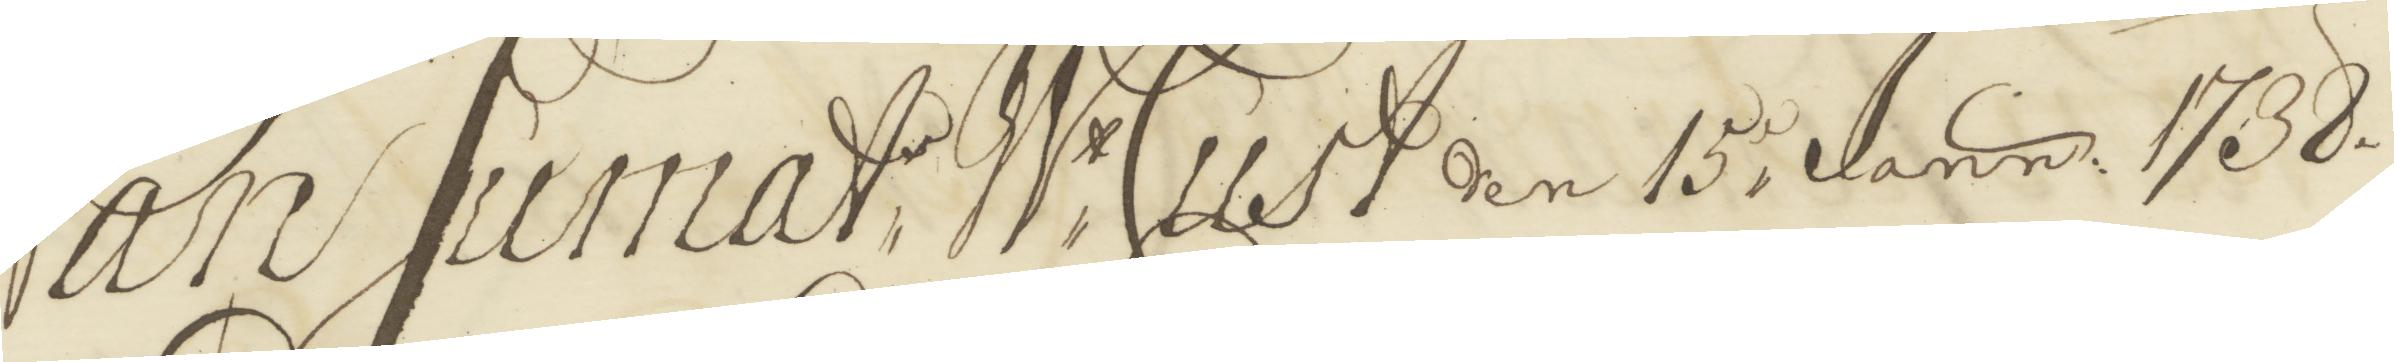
Van Sumat„s W„t Cust den 15„e Jann: 1738.
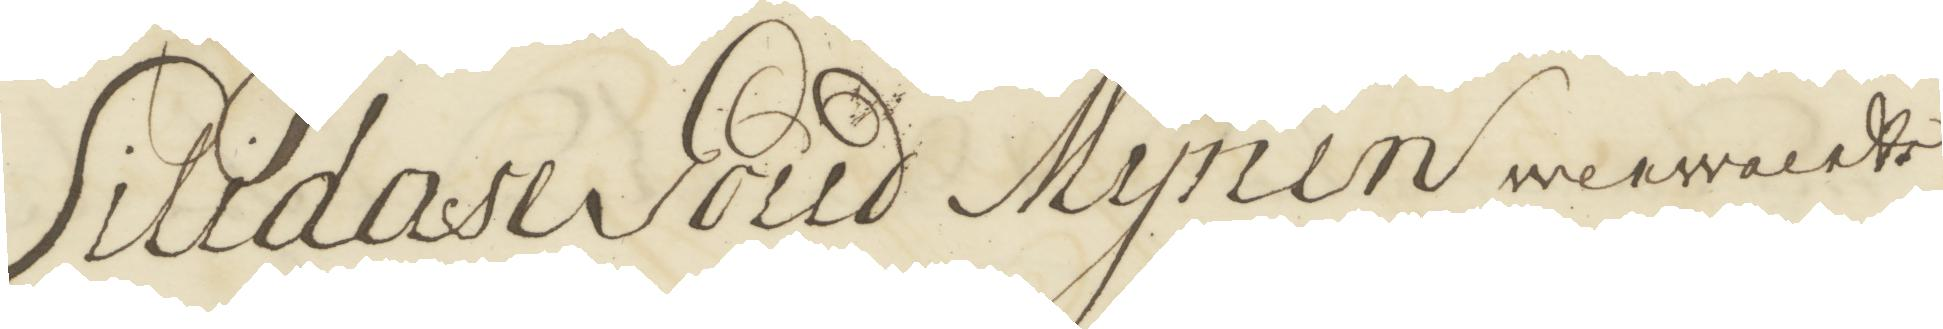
Silldase Goud Mijnen werwaerts
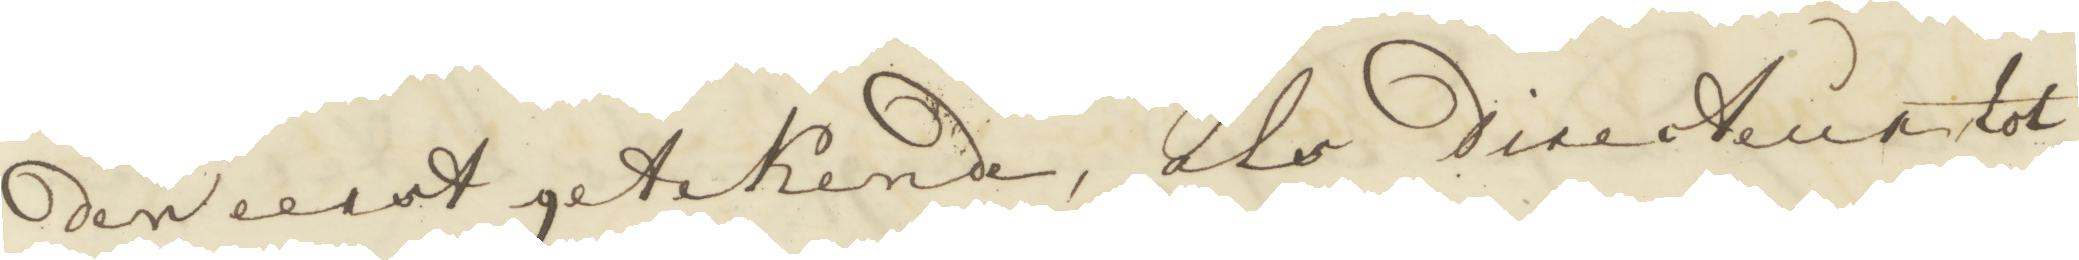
den eerst getekende, als directeur, tot
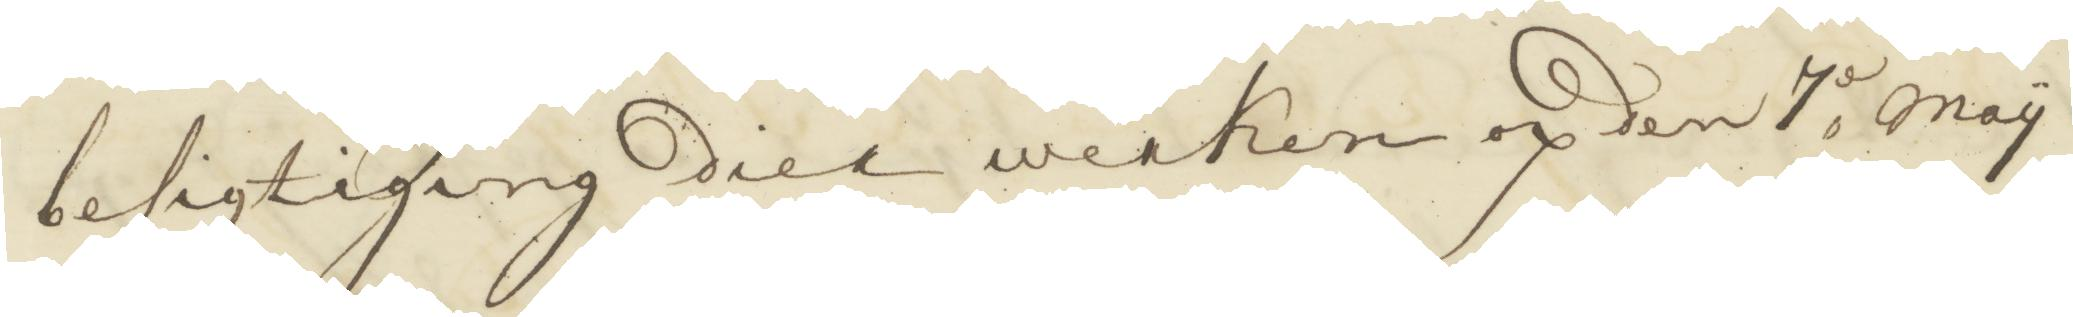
besigtiging dier werken op den 7„e maij
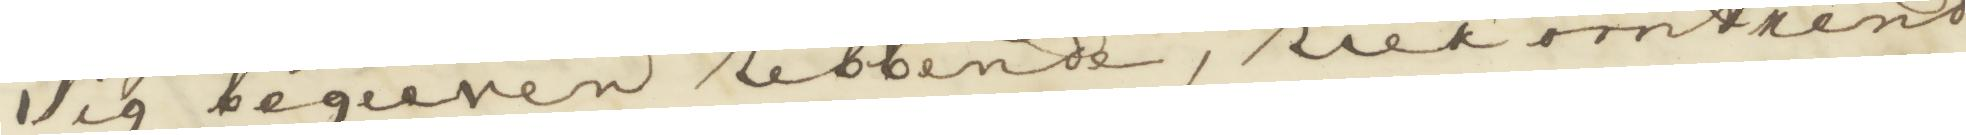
sig begeeven hebbende, hier omtrend
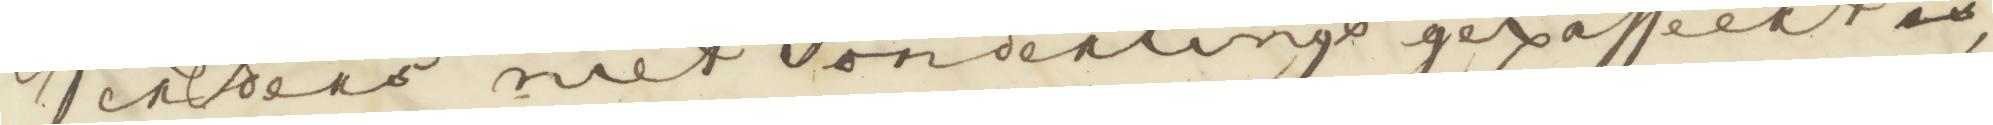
Verders niet sonderlings gepasseert is,
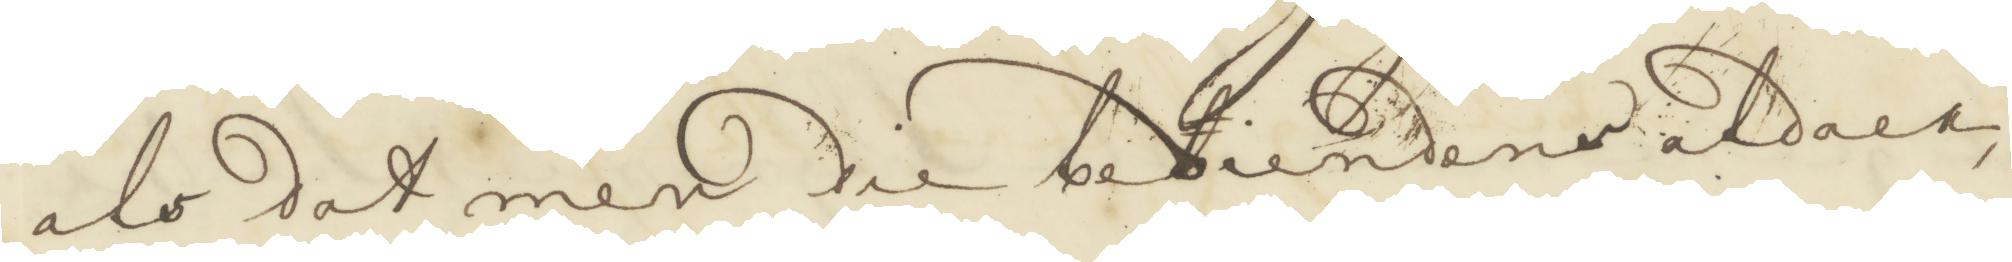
als dat men die bediendens aldaer,
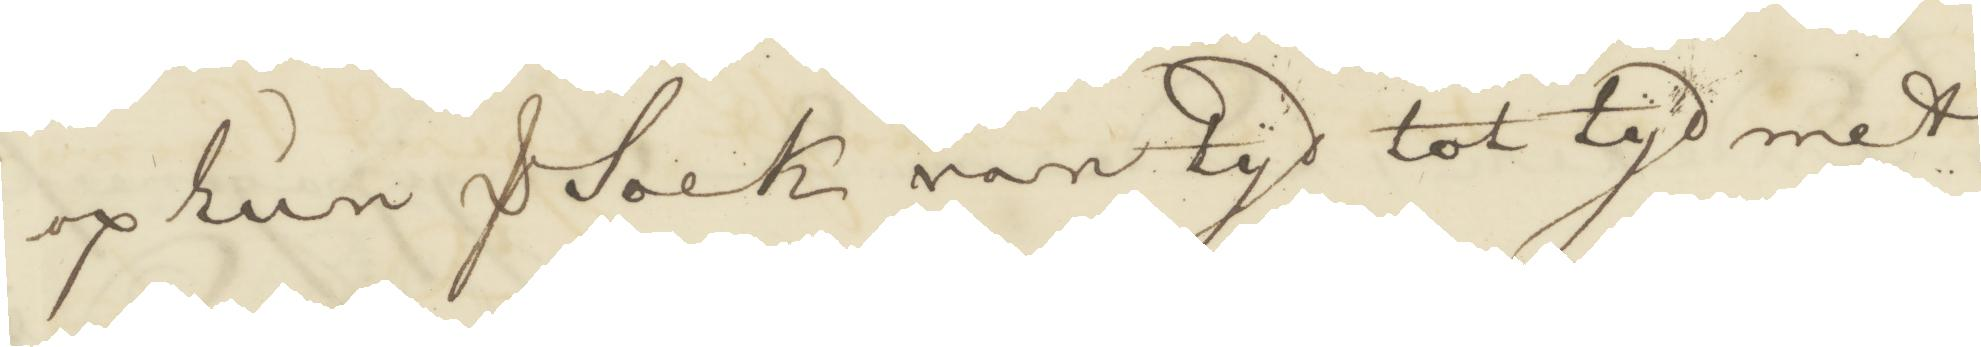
op hun versoek van tijd tot tijd met
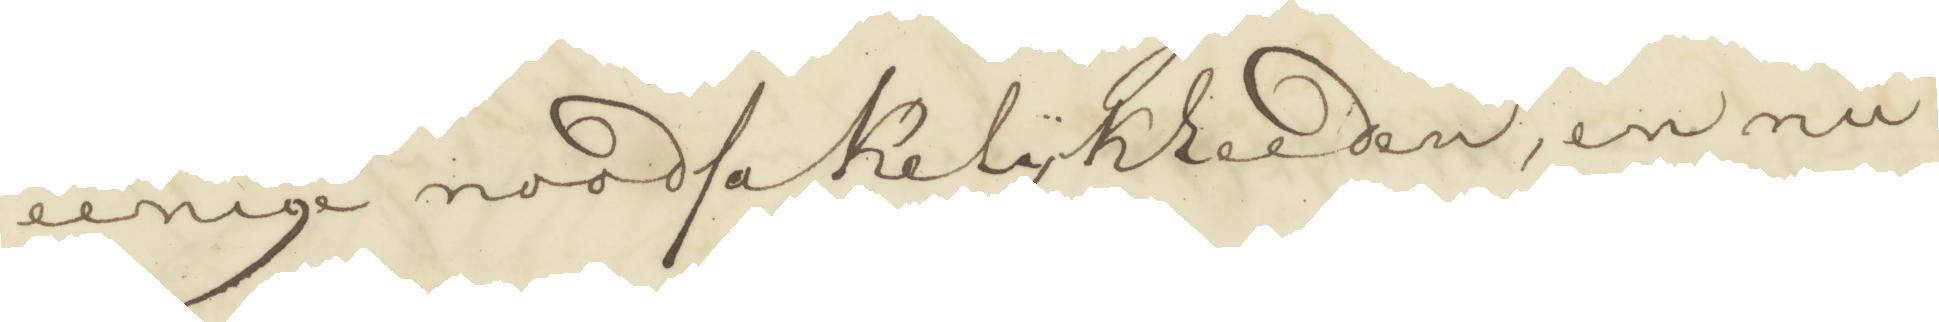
eenige noodsakelijkheeden, en nu
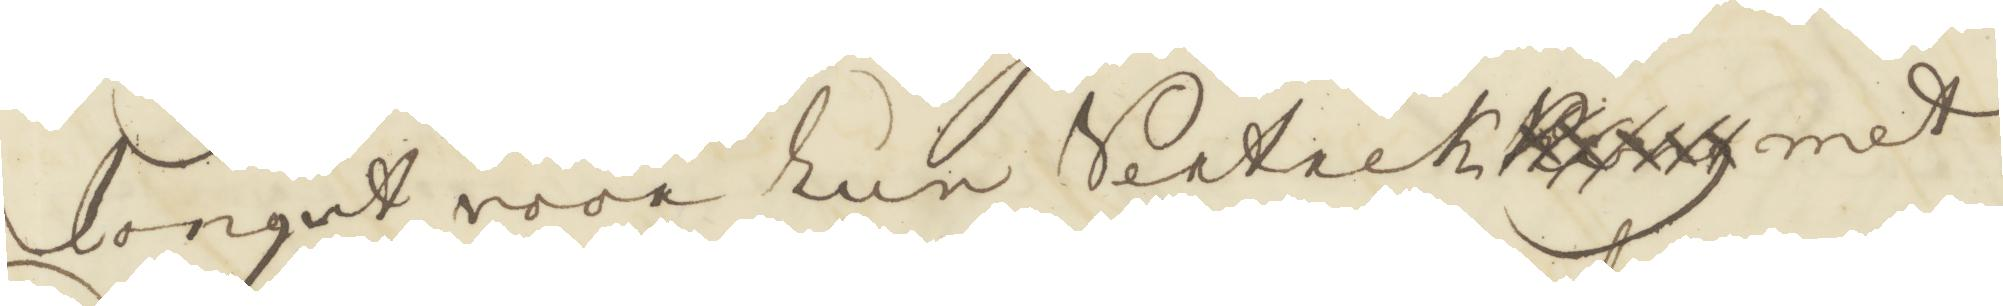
langst voor hun Vertrek kome met
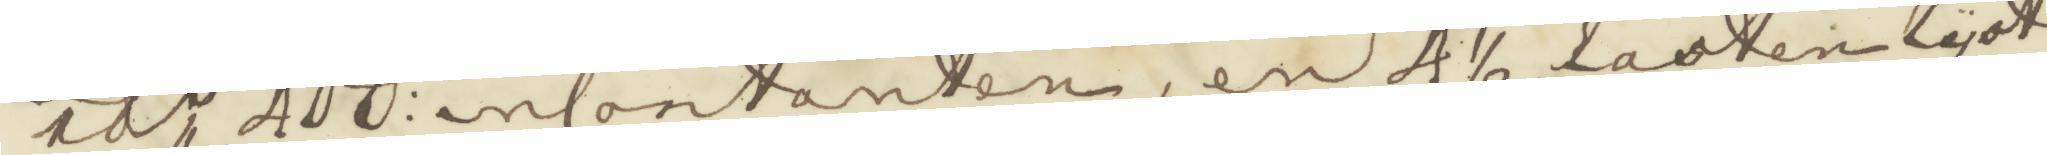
rd„s 400: in Contanten, en 4½ Lasten rijst
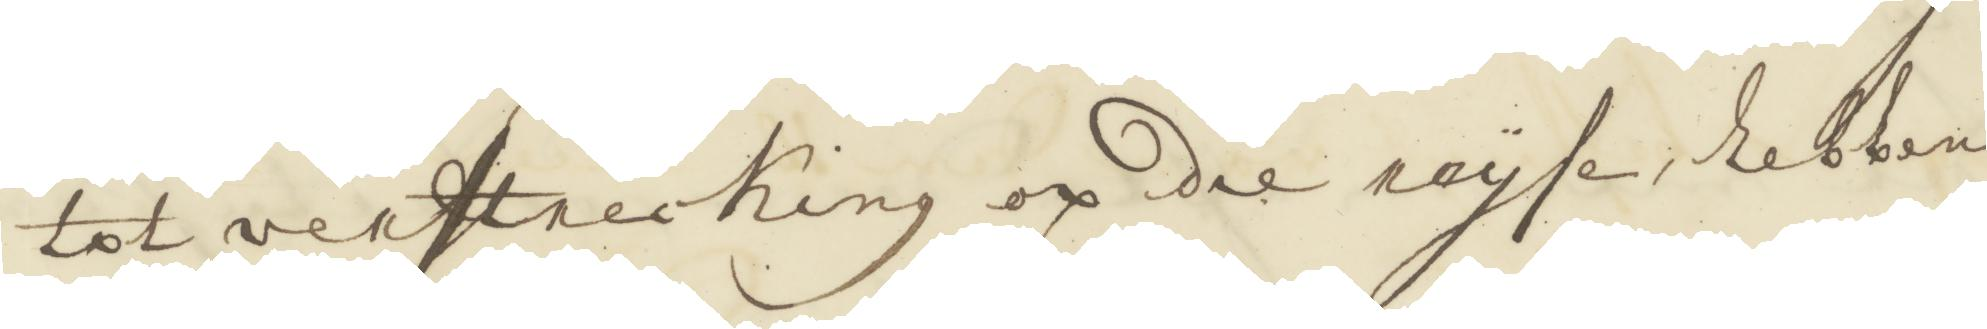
tot verstrecking op die reijse, hebben
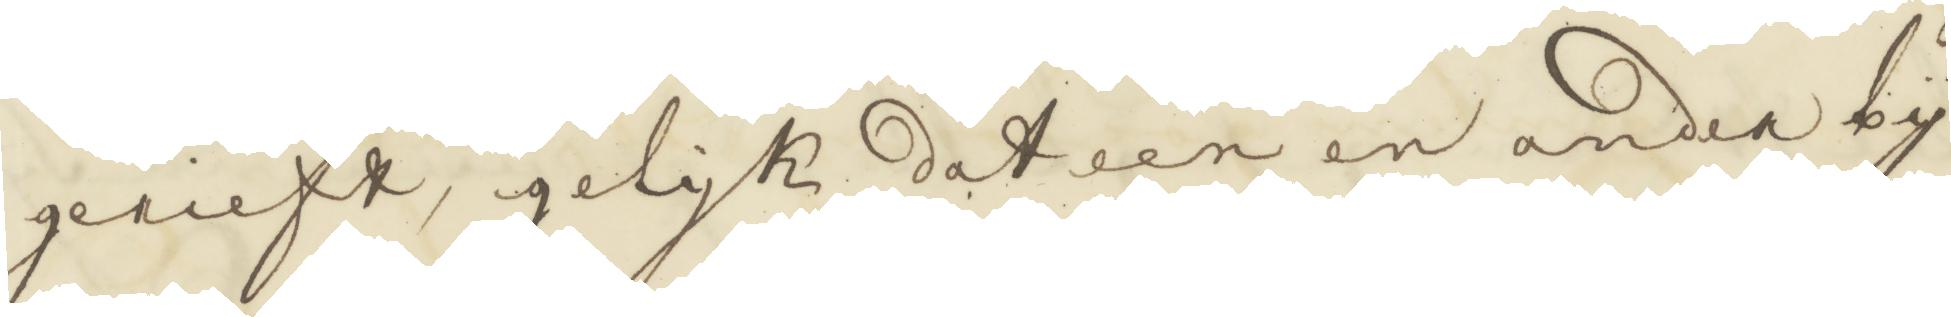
gerieft, gelijk dat een en ander bij
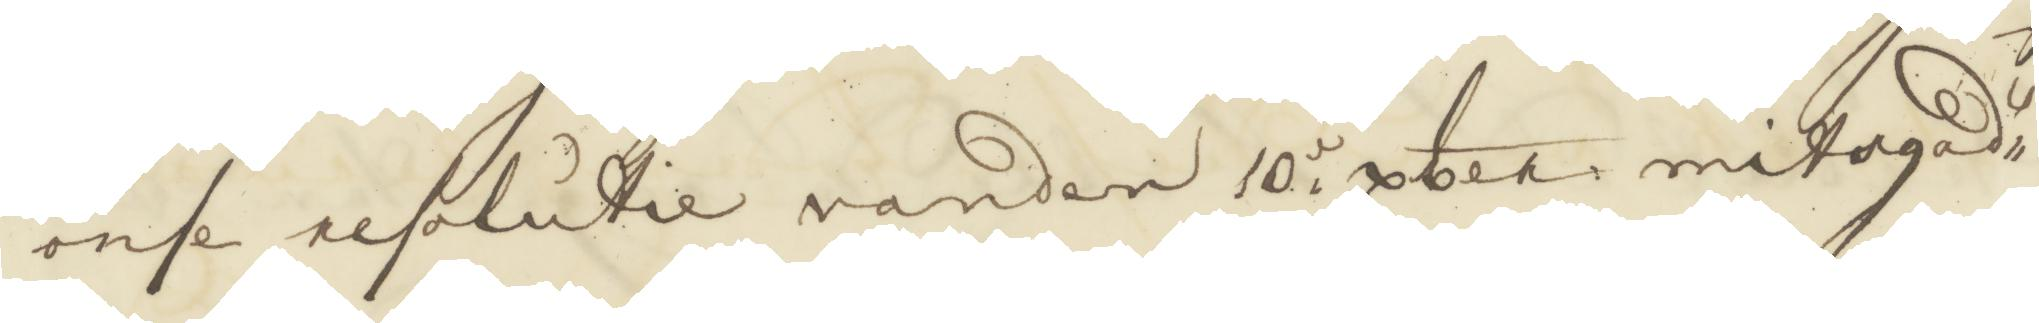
onse resolutie van den 10:e xber: mitsgad„s
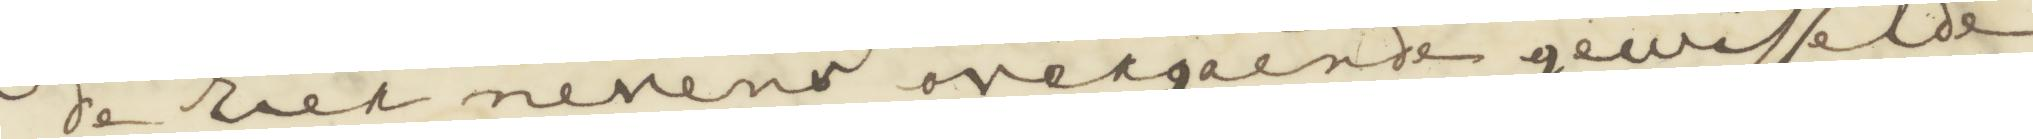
de hier nevens overgaende gewisselde
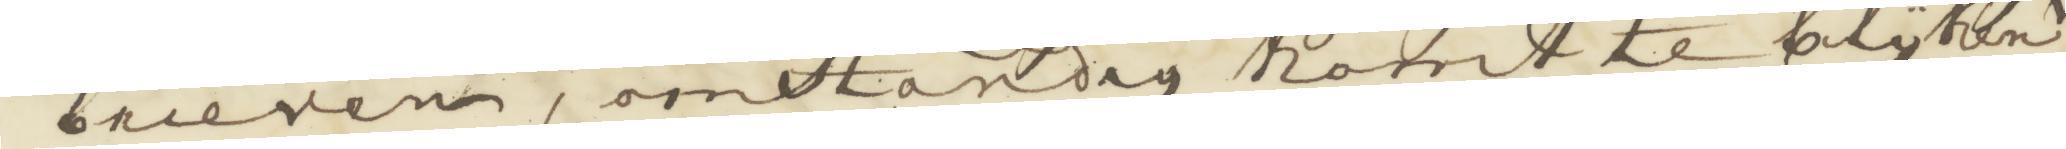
brieven, omstandig komt te blijken
